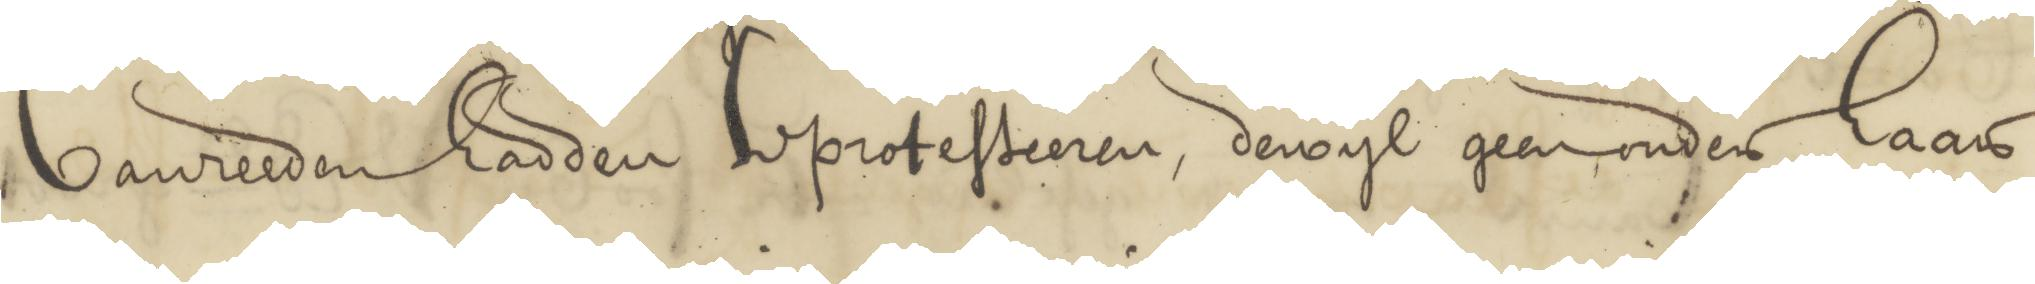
vanreeden hadden, te protesteeren, dewijl geen onder haar
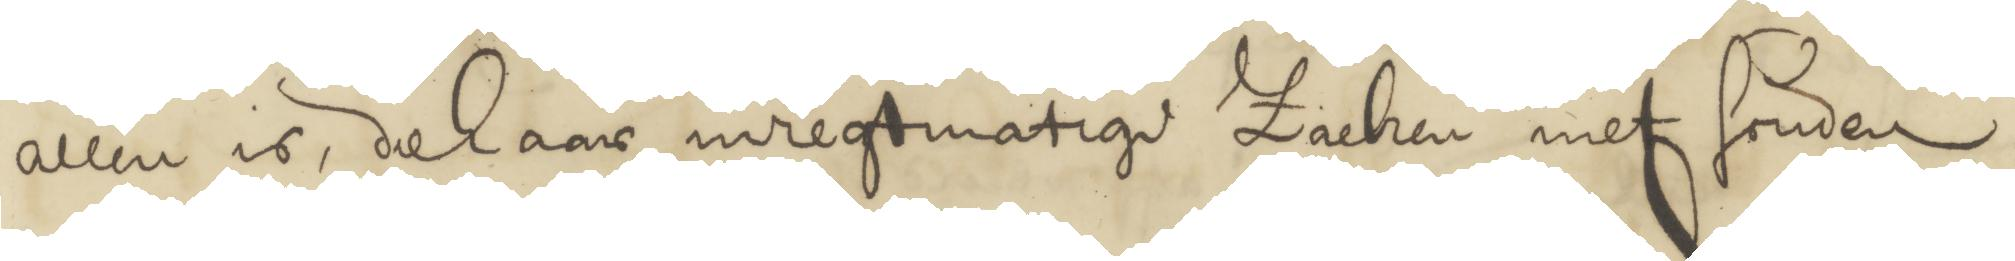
allen is, die haar inregtmatige zaeken niet souden
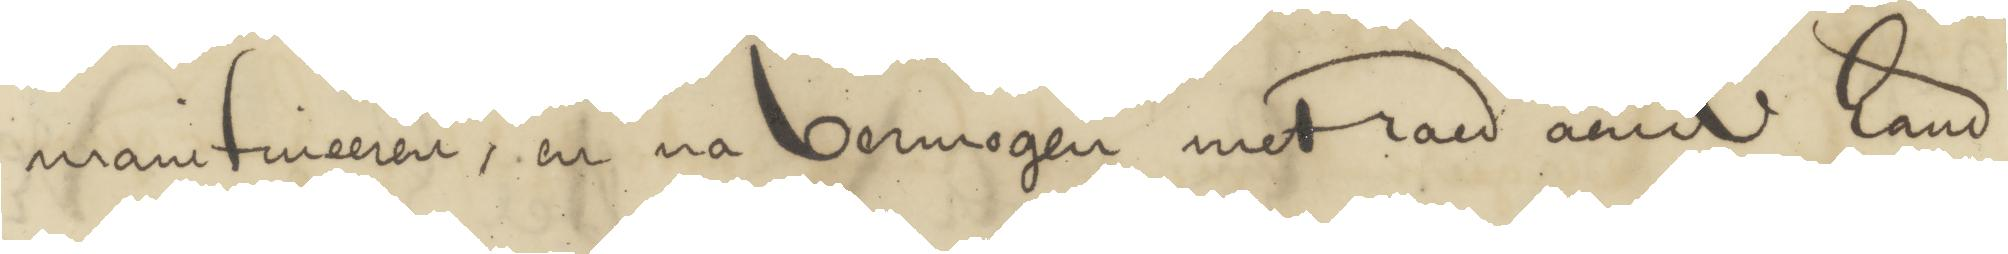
maintineeren, en na vermogen met raed aende hand
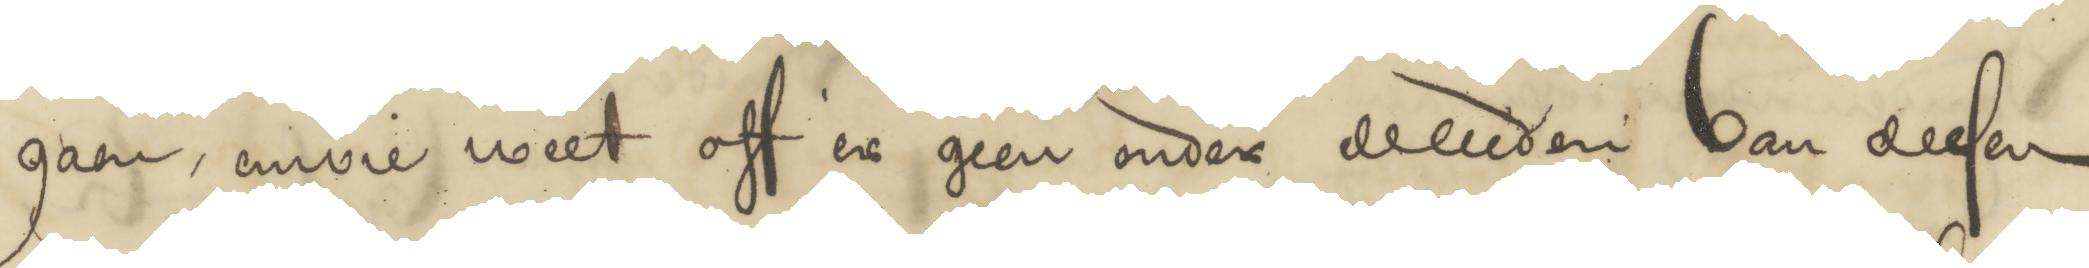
gaen, enwie weet off 'er geen onder deleeden van deesen
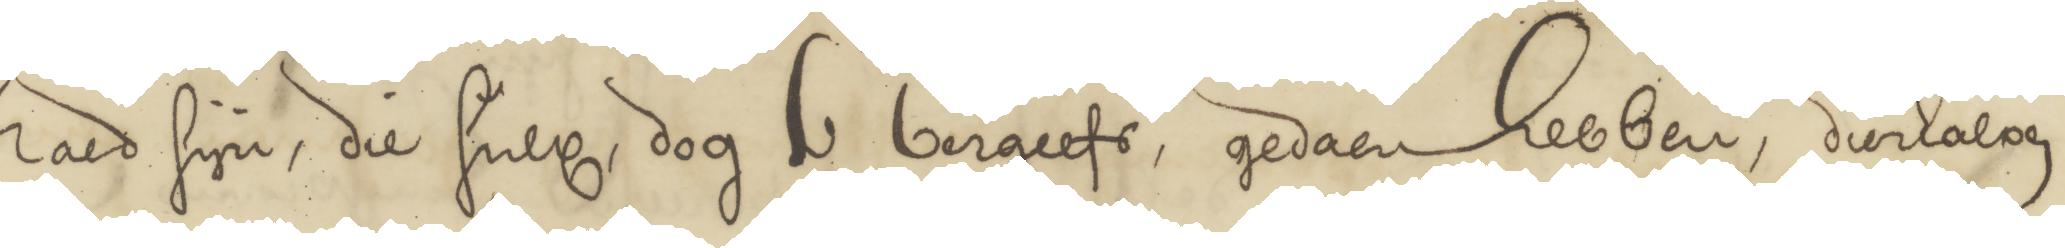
raed sijn, die sulx, dog te vergeefs, gedaen hebben, dierhalven
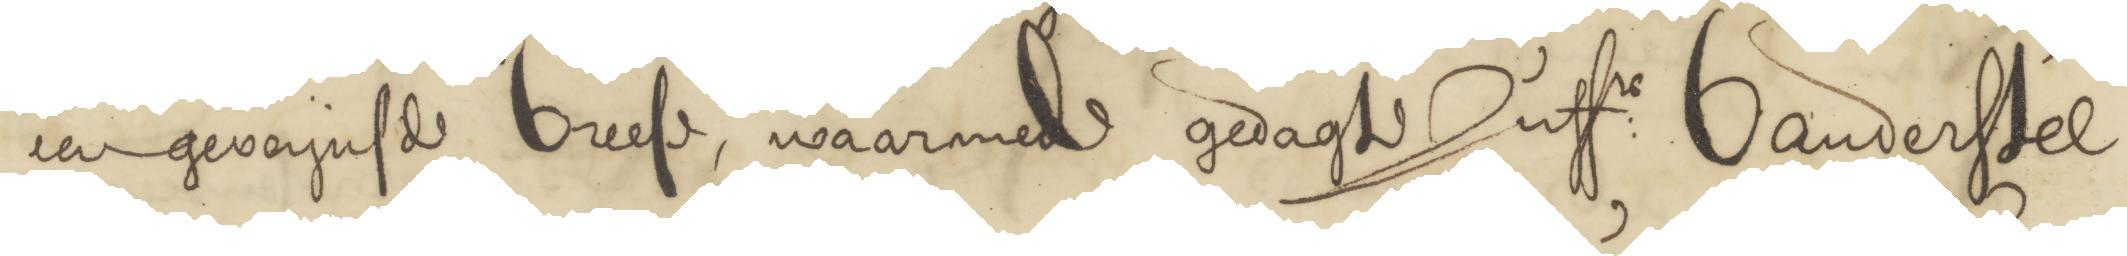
een geveijnsde vrese, waarmede gedagte Juff:r Vanderstel
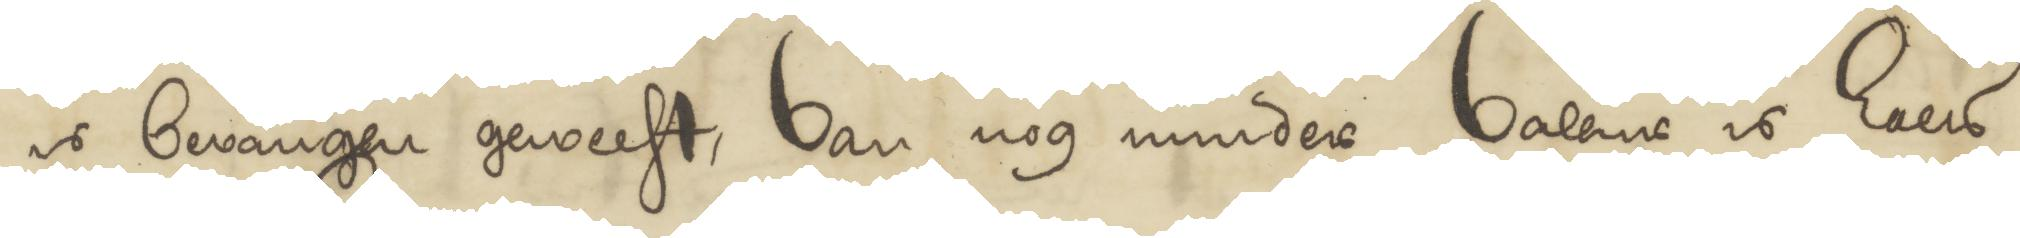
is bevangen geweest, van nog minder valeur is haer
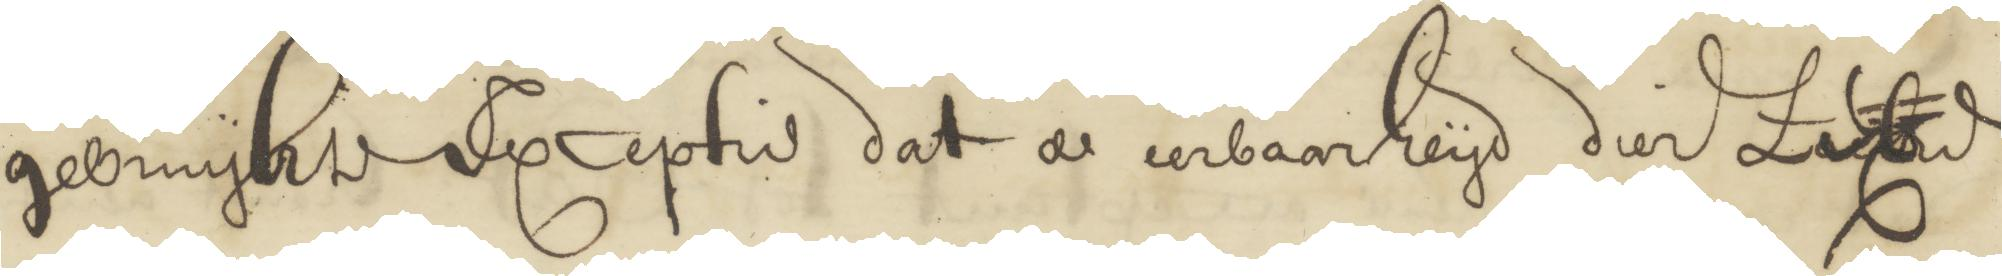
gebruijkte Exceptie dat de eerbaarheijd dier zelve
